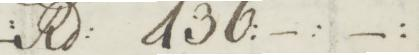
Rd:s 436: —: —:
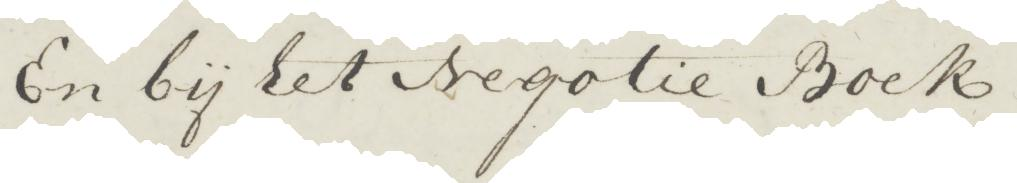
En bij het Negotie Boek
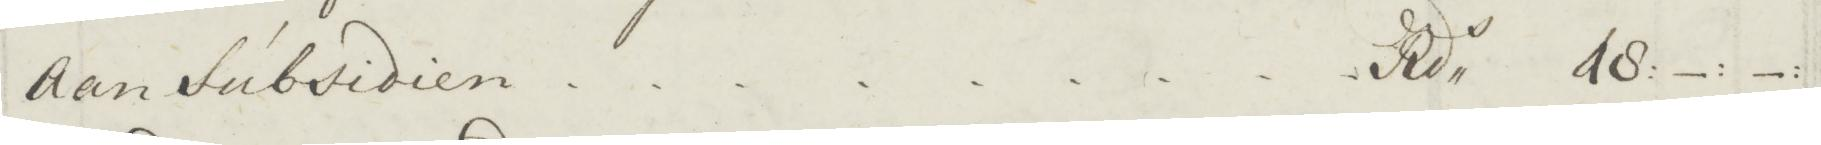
Aan Subsidien . . . . . . . . . Rd„s 48: —: —:
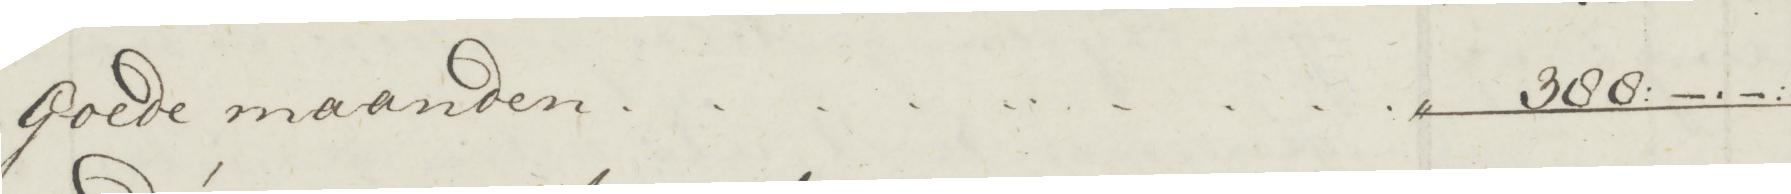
Goede maanden .. . . . . . . . . „ 388: —: —:
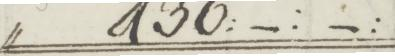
„ 436: —: —:
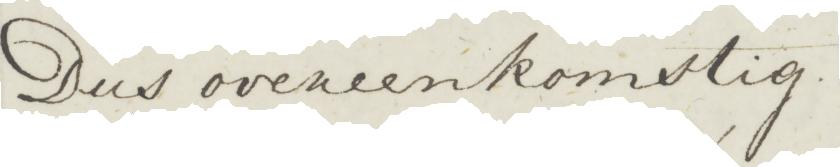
Dus overeenkomstig.
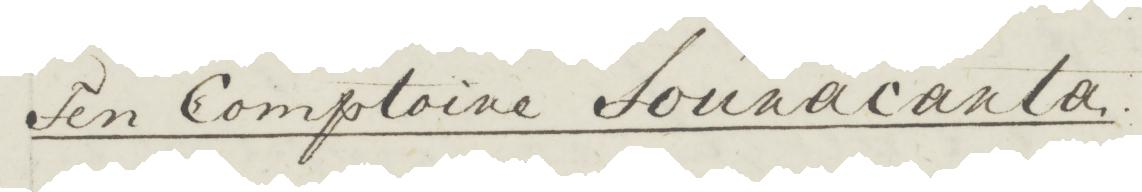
Ten Comptoire Souracarta.
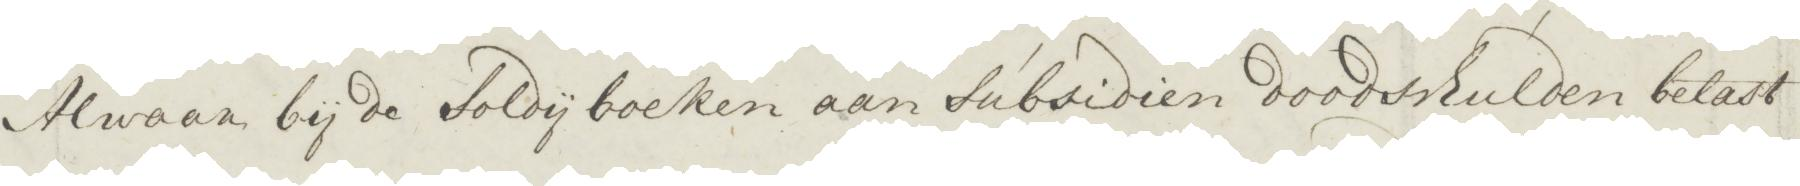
Alwaar bij de Soldij boeken aan subsidien doodschulden belast
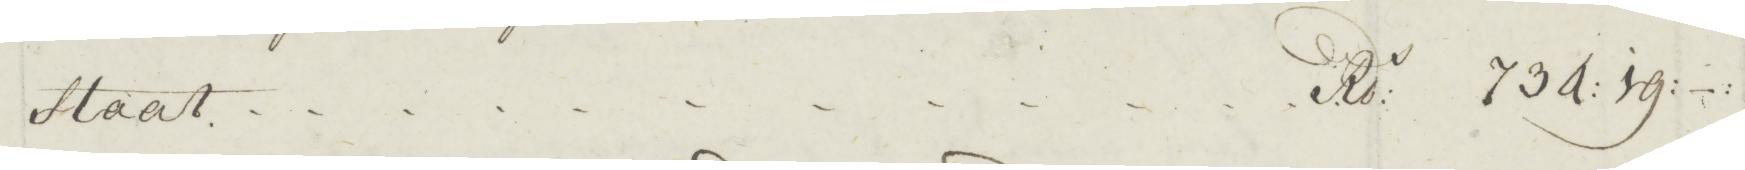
Staat . . . . . . . . . . . . . Rd:s 734: 19: —:
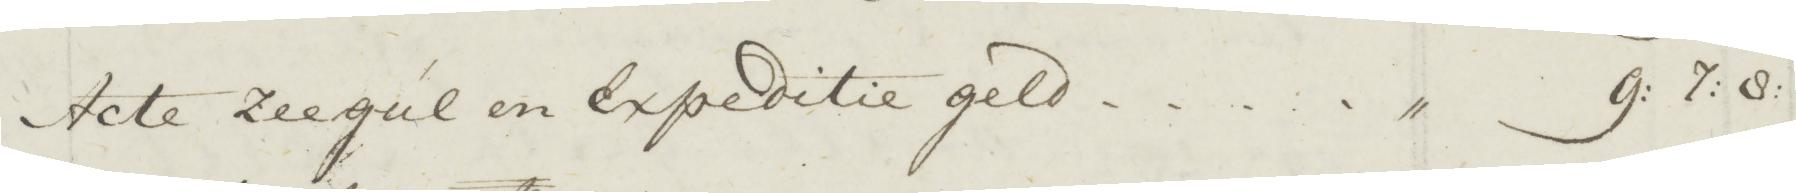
Acte zeegul en Expeditie geld . . . . . „ 9: 7: 8:
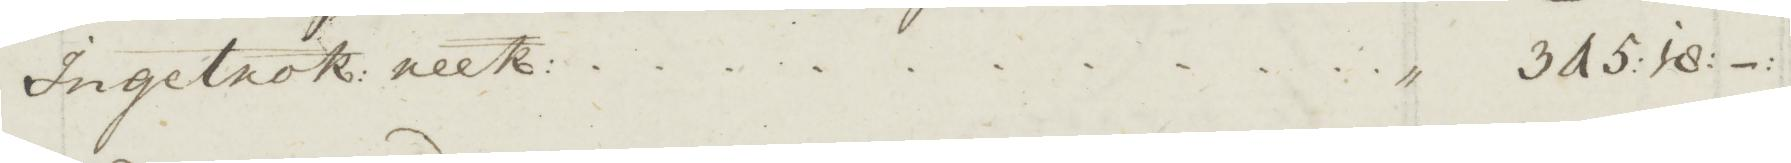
Ingetrok: reek: . . . . . . . . . . . „ 345: 18: —:
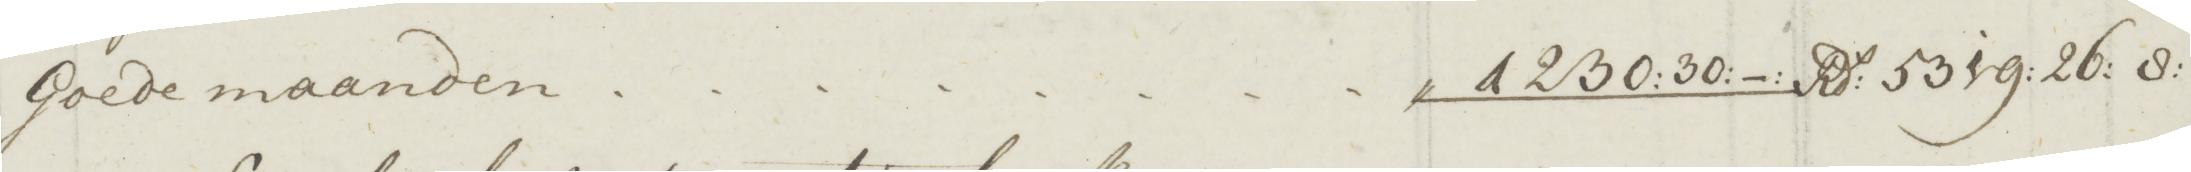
Goede maanden . . . . . . . . . „ 4230: 30: —: Rd:s 5319: 26: 8:
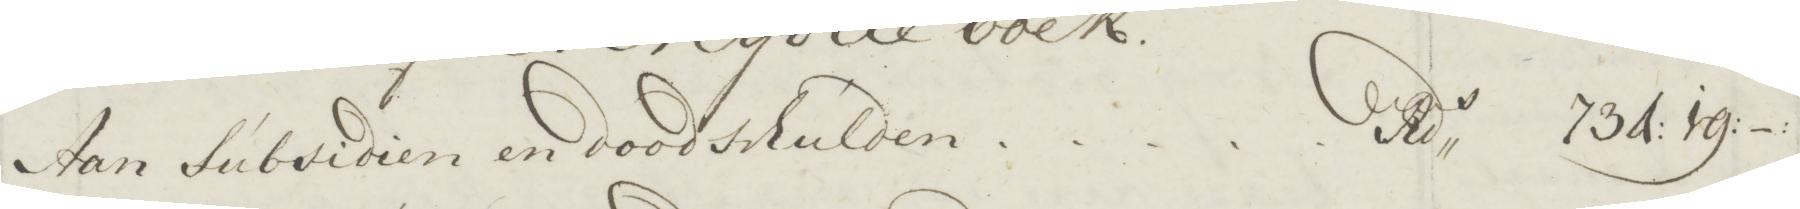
Aan Subsidien en dood schulden . . . . . Rd„s 734: 19: —:
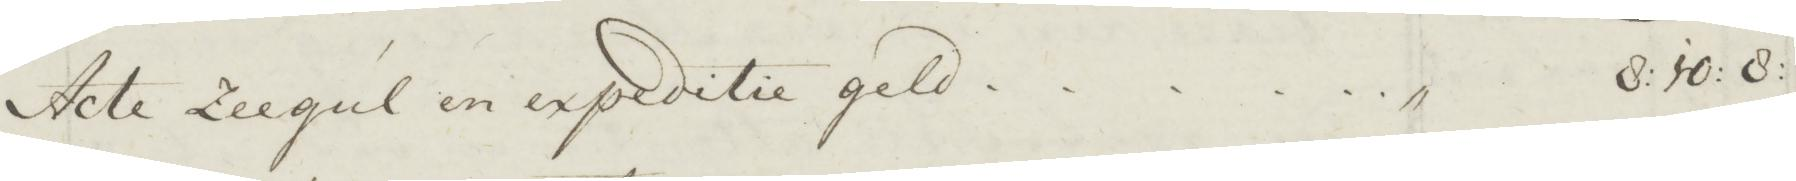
Acte Zeegul en expeditie geld . . . . . . „ 8: 10: 8:
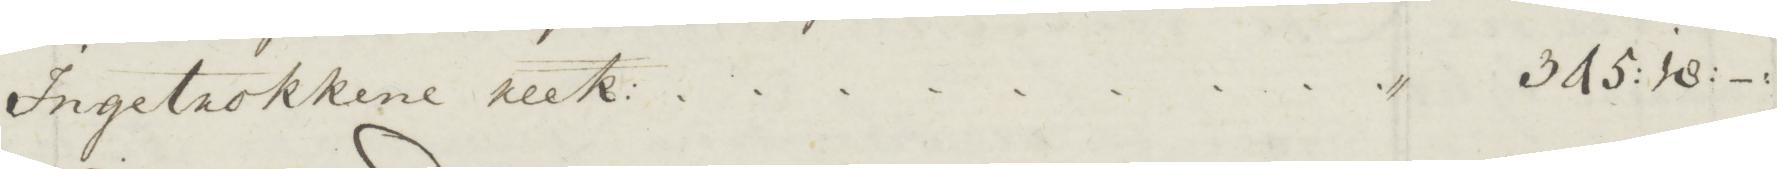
Ingetrokkene reek: . . . . . . . . .„ 345: 18: —:
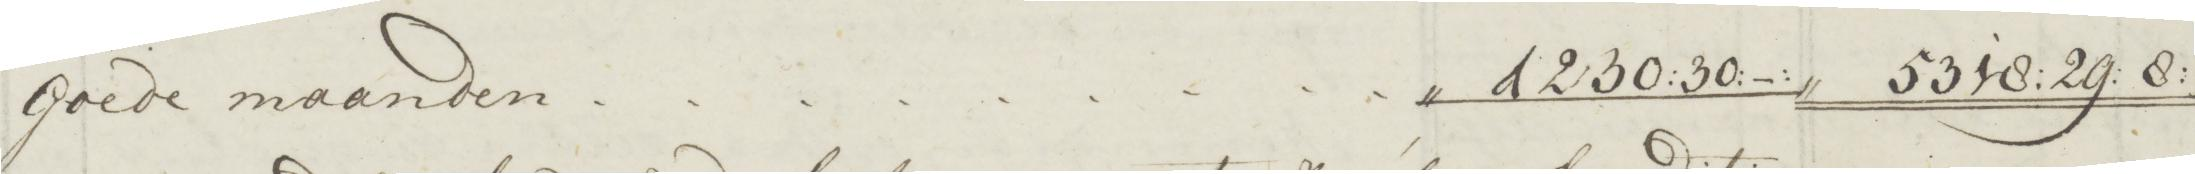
Goede maanden . . . . . . . . „ 4230: 30: —: „ 5318: 29: 8:
